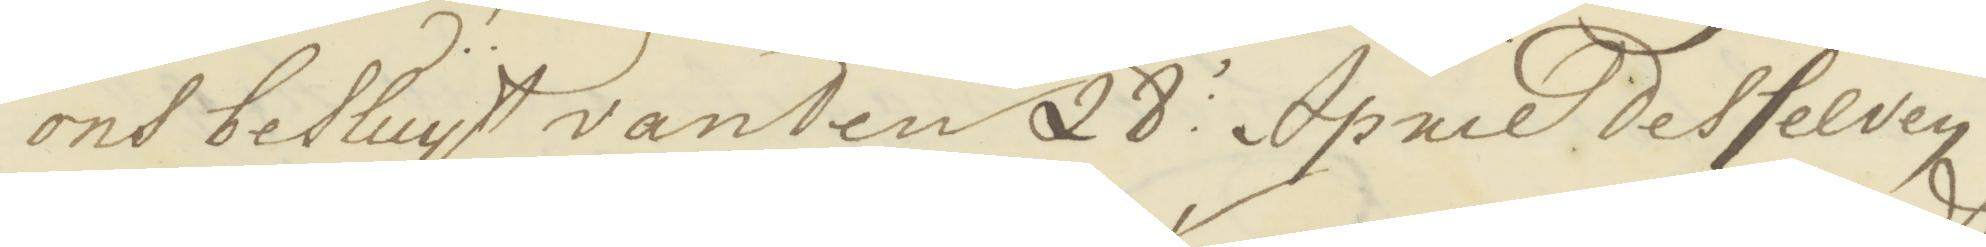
ons besluijt van den 28:' April desselven
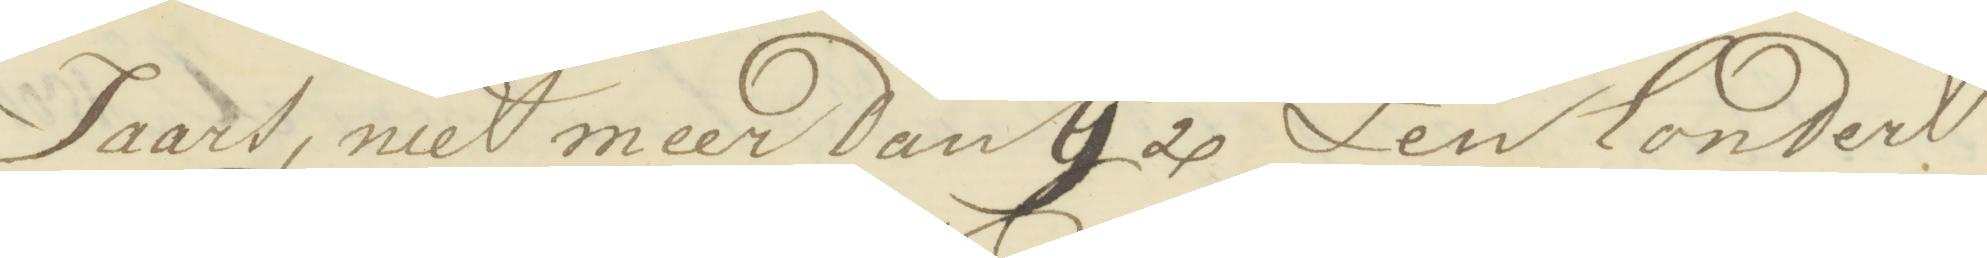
Iaars, niet meer dan 9 1/2 ten hondert
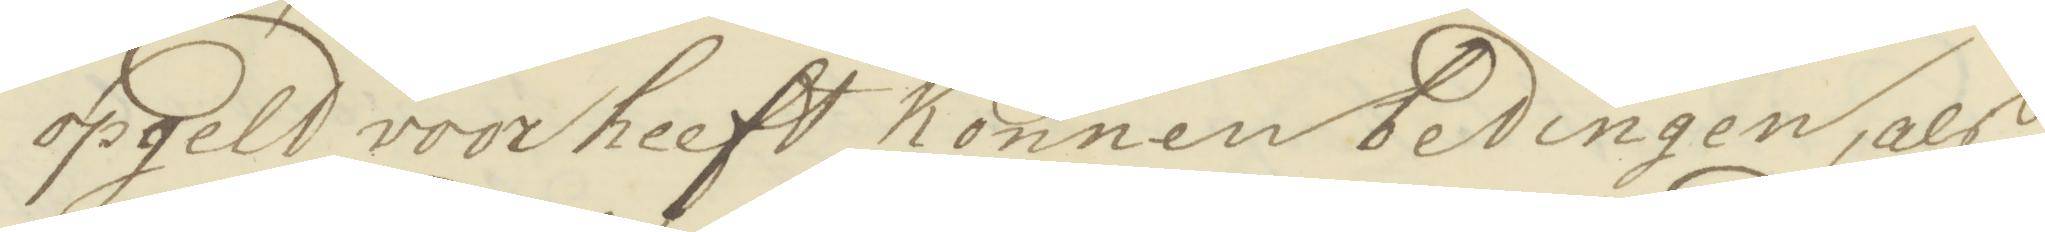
opgeld voor heeft Konnen bedingen, als
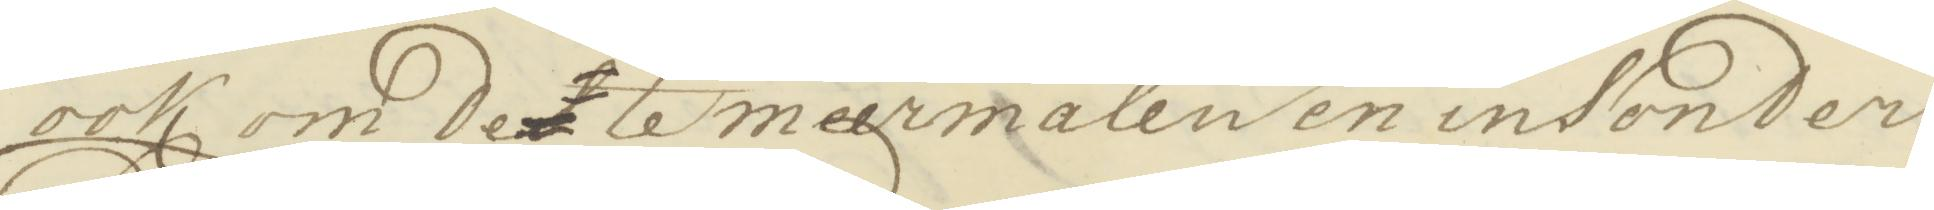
ook om des te meermalen en insonder
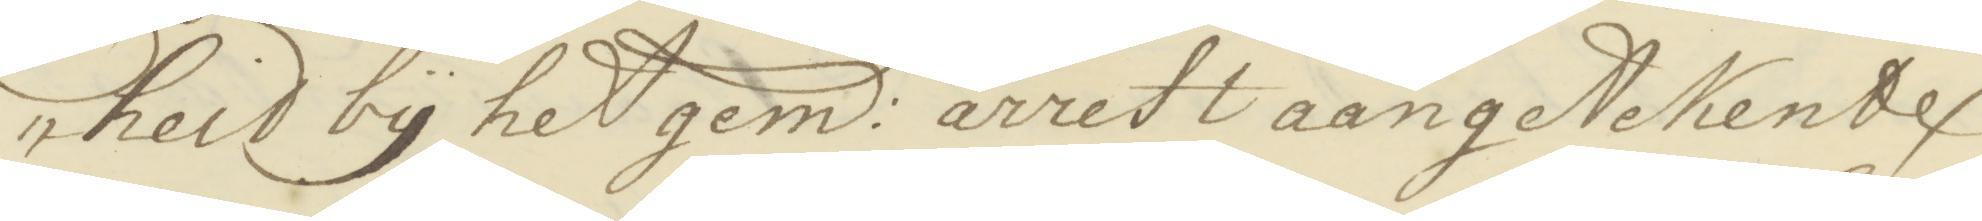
„heid bij het gem: arrest aangetekende
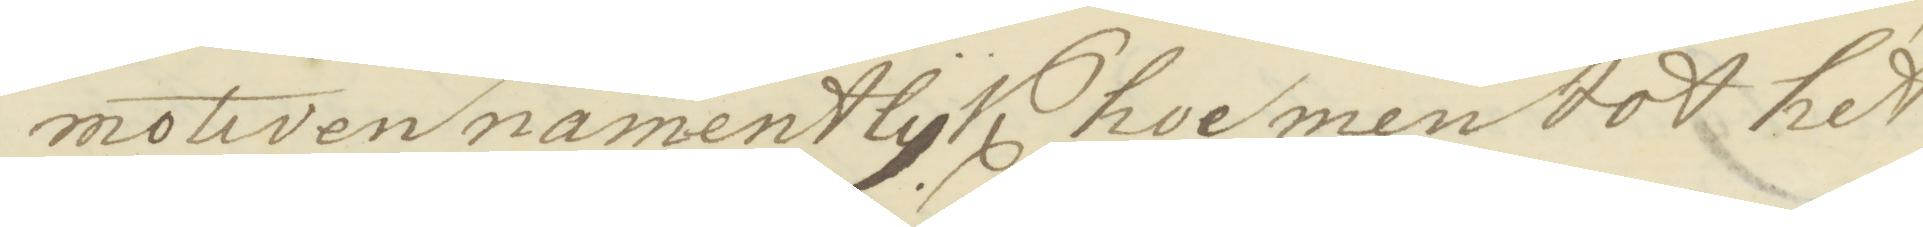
motiven namentlijk hoe men tot het
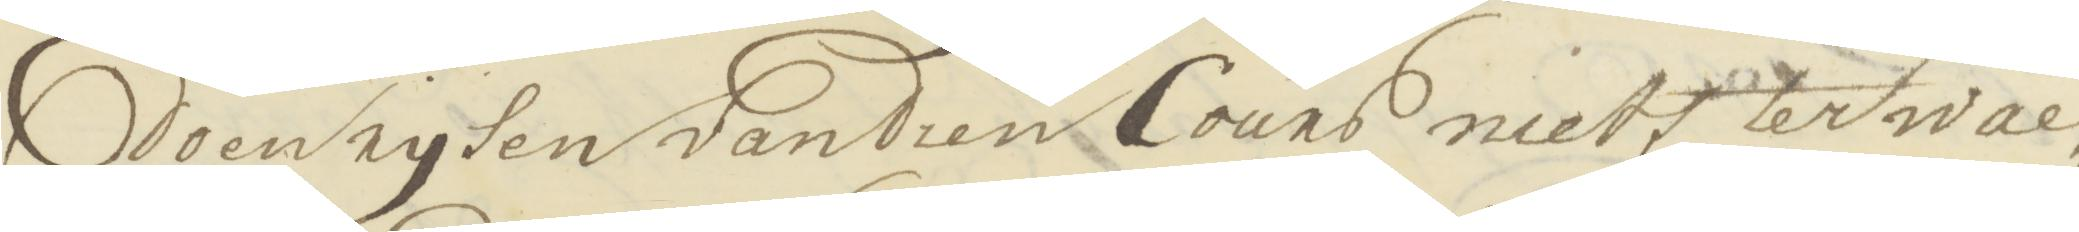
doen rijsen van dien Cours niets ter wae„
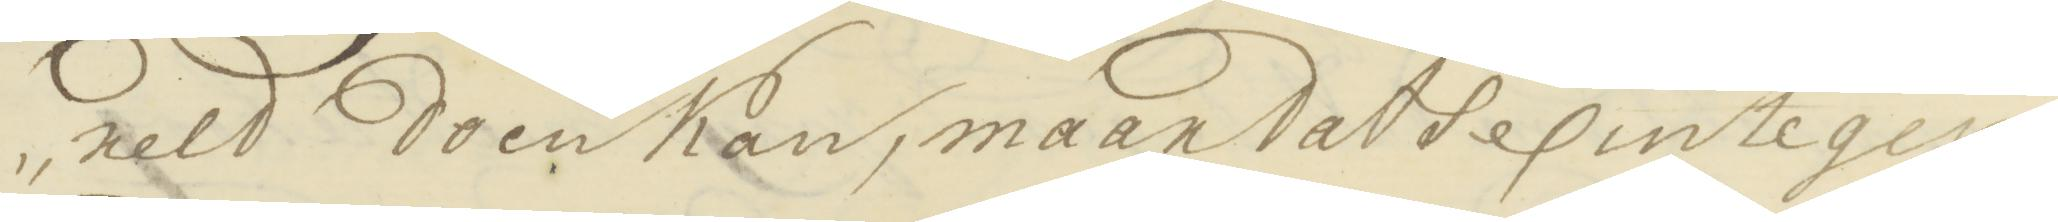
„reld doen Kan, maar dat se integen
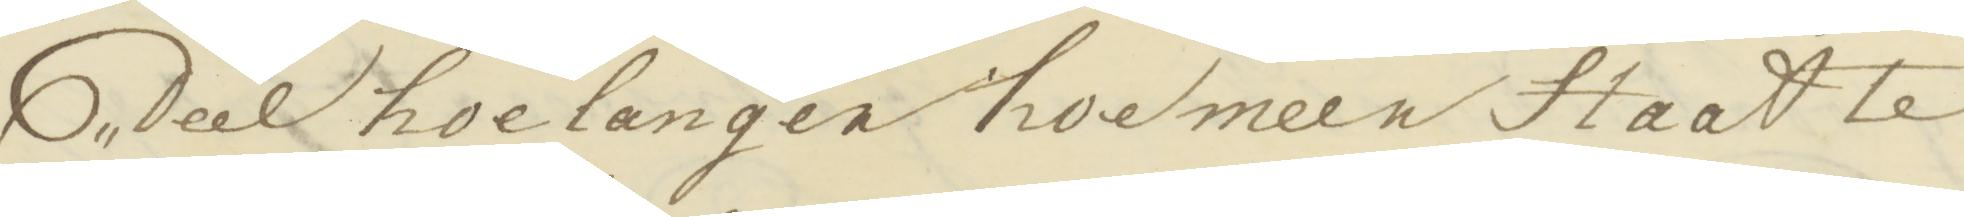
deel hoe langer hoe meer Staat te
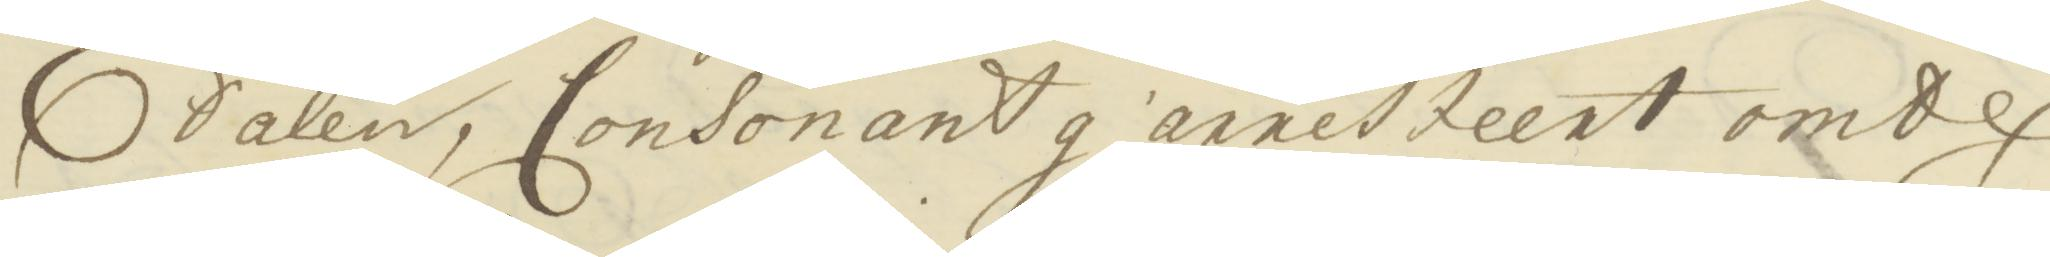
dalen, Consonant g’arresteert om de
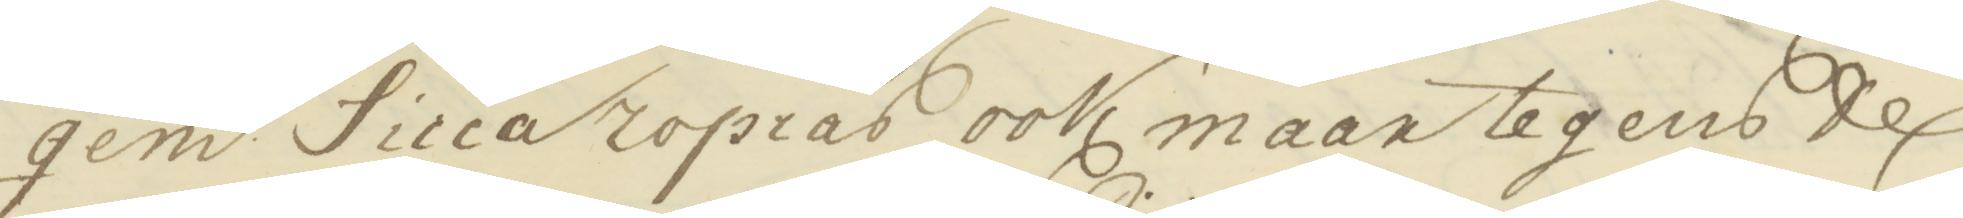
gem: Sicca ropias ook maar tegens de
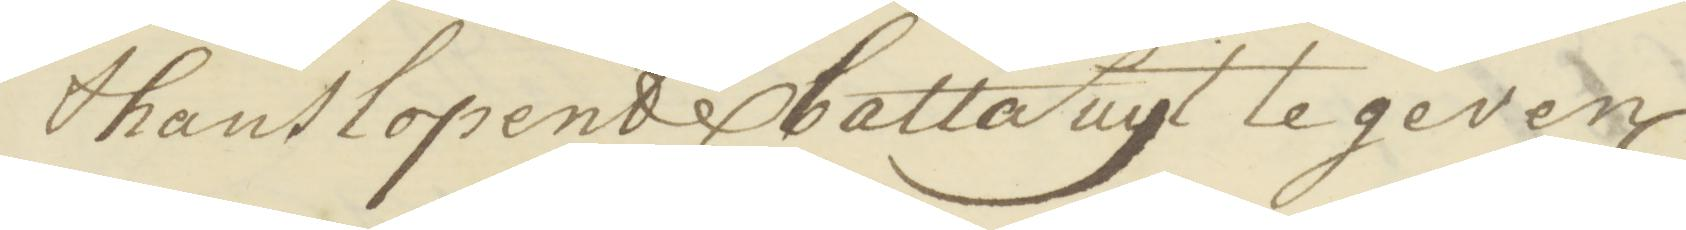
Thans lopend batta uijt te geven
